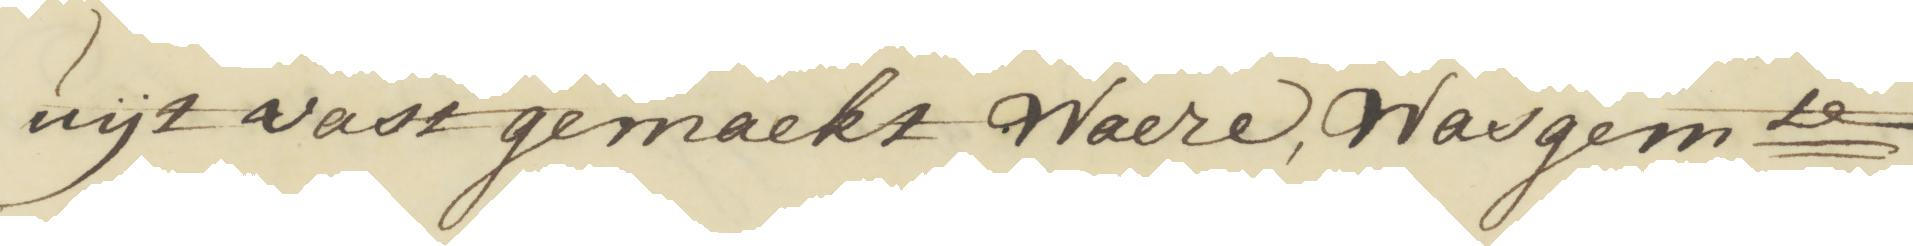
uijt vast gemaekt waere, was gem=te
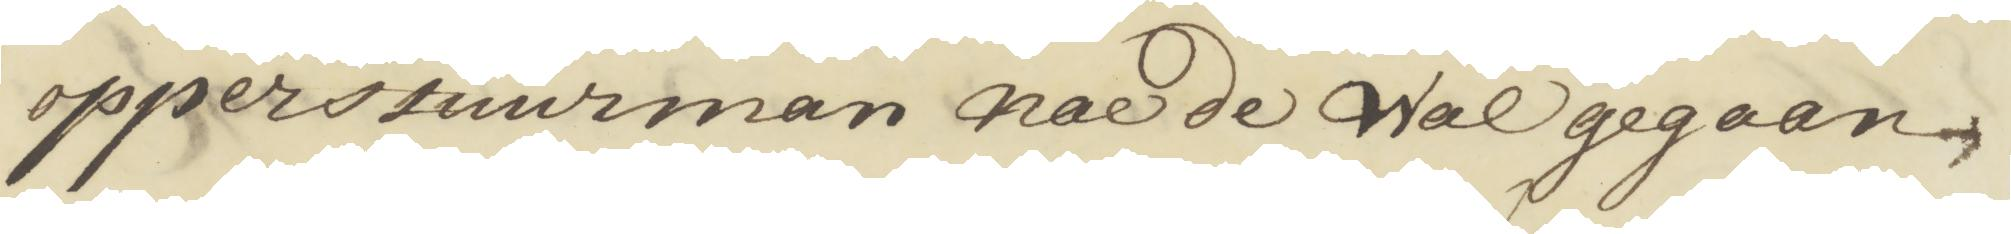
opperstuurman nae de wal gegaan,
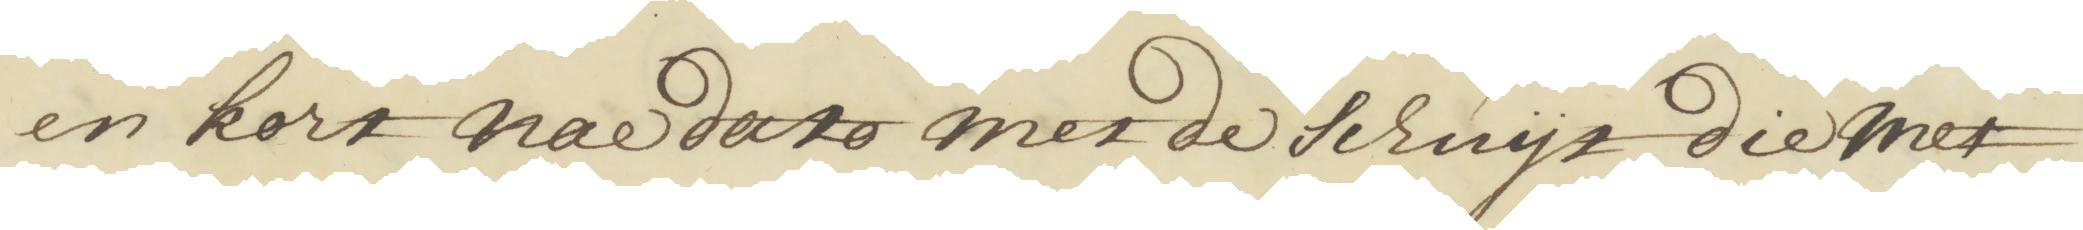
en kort nae dato met de schuijt die met
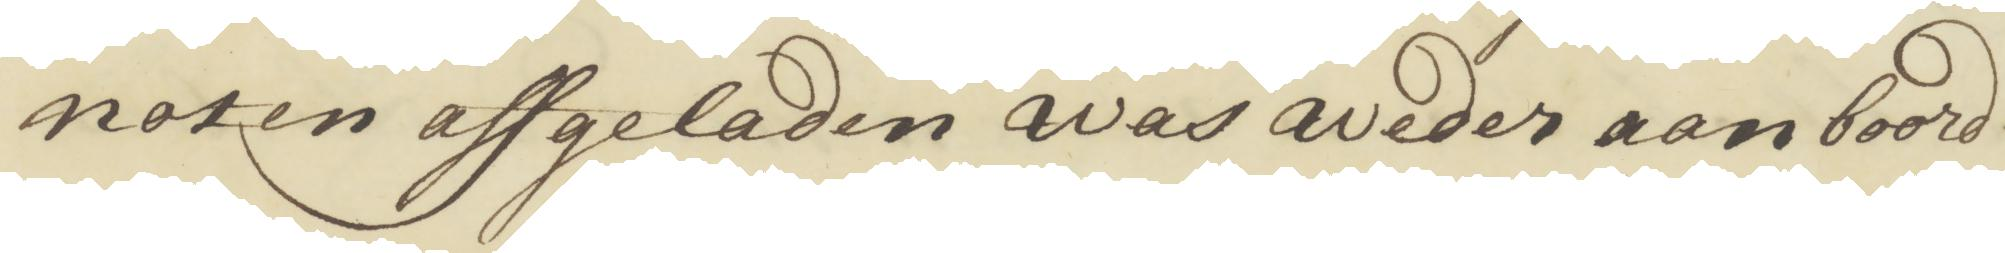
noten affgeladen was weder aan boord
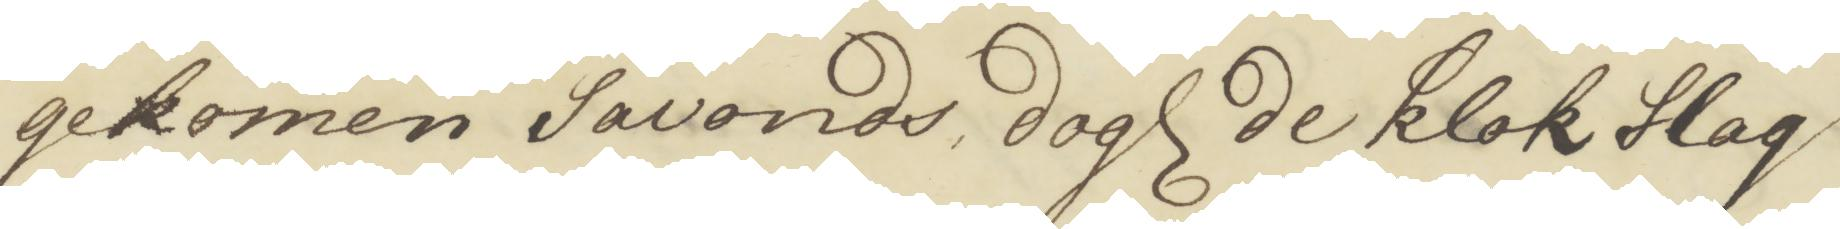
gekomen s avonds, dogh de klok slagh
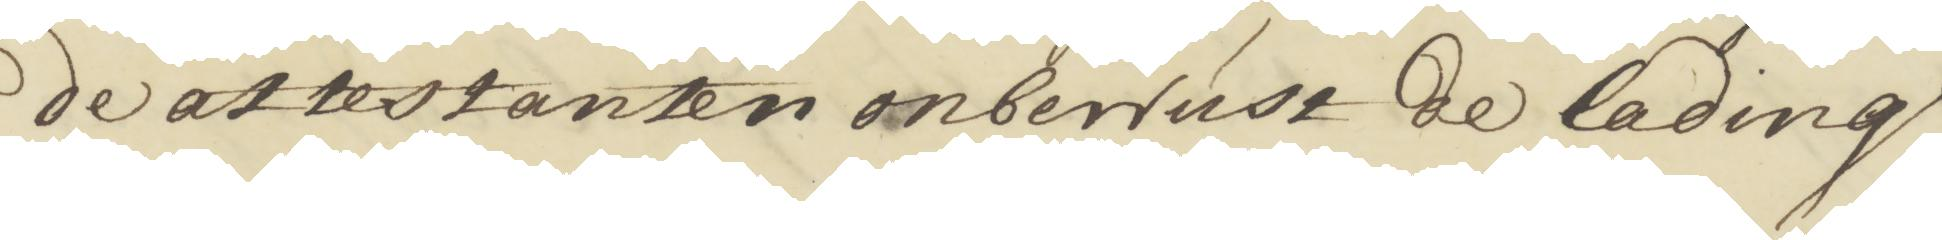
de attestanten onbewust de ladingh
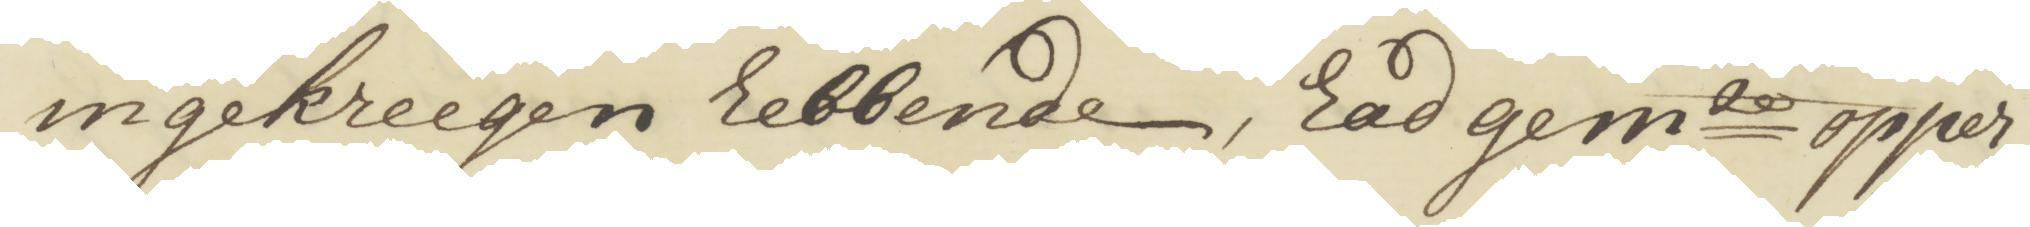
ingekreegen hebbende, had gem=te opper
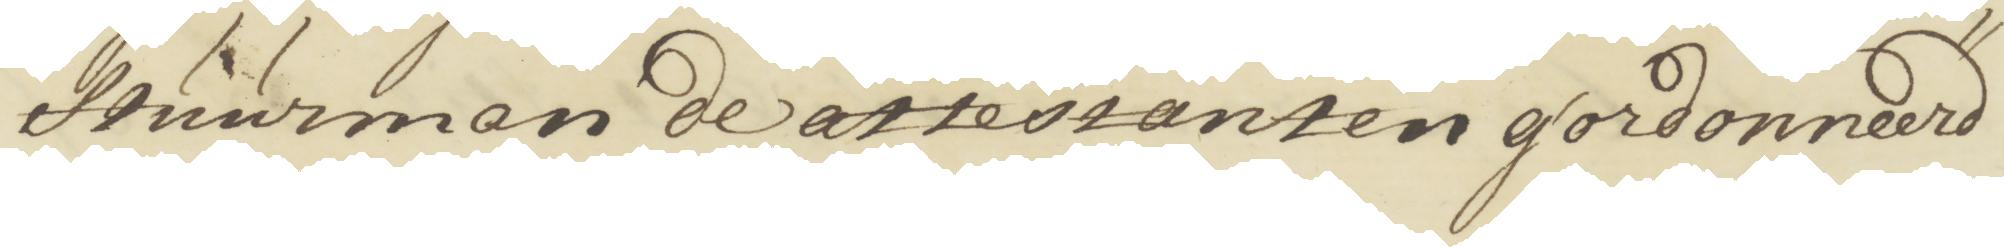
stuurman de attestanten g'ordonneerd
